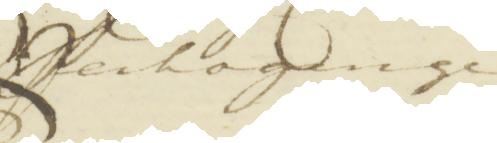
Verhoginge
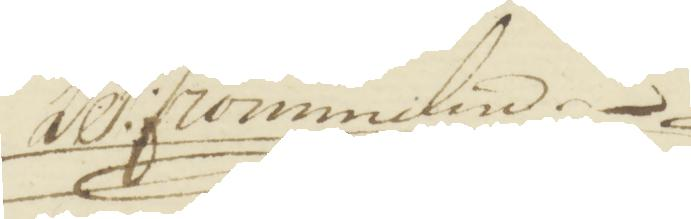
D:F:Crommelin.—
